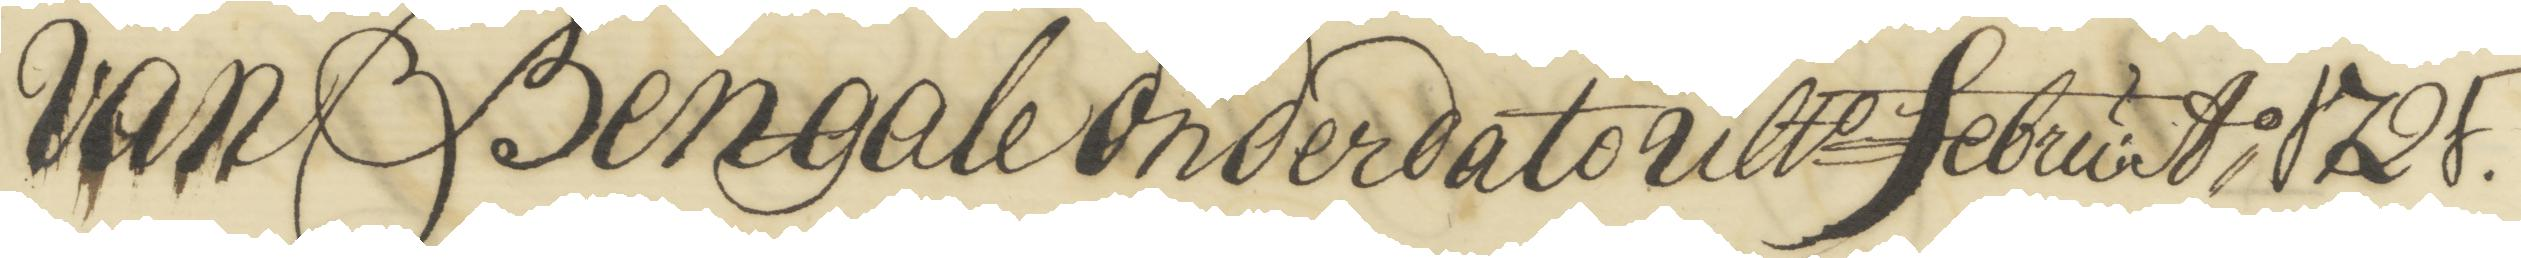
van Bengale onderdato ult=o febru: A„o 1721.
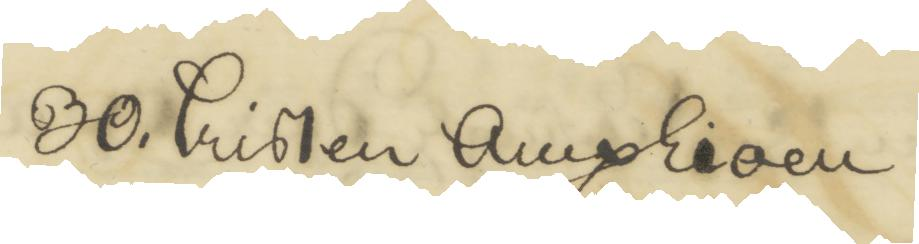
30. kisten Amphioen
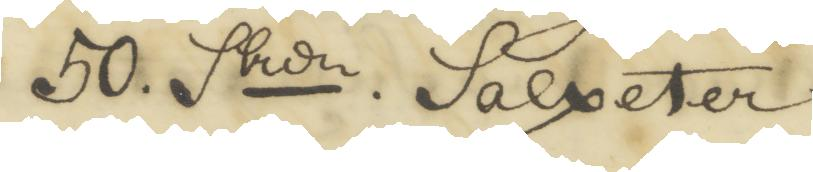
50. S:ken. Salpeter
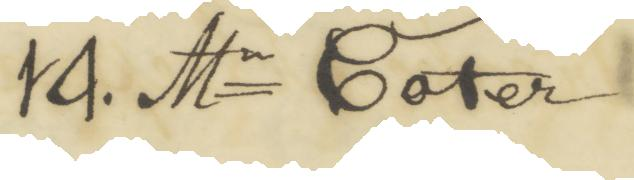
14. M=n boter
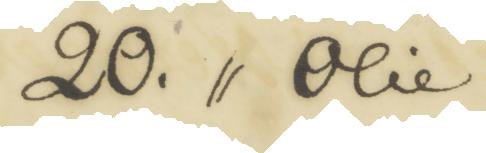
20. „ Olie
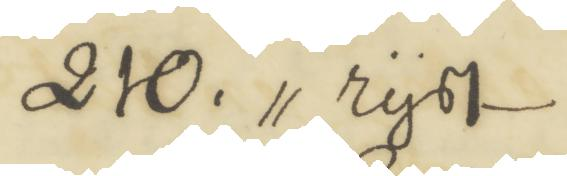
210. „ rijst
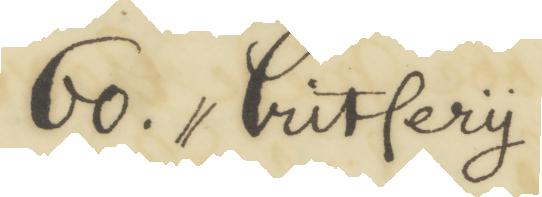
60. „ kitserij
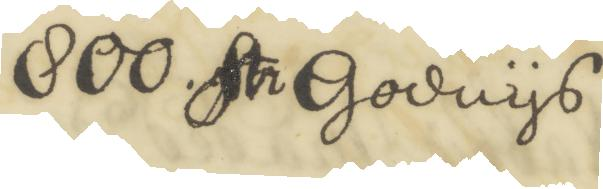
800. str goenijs
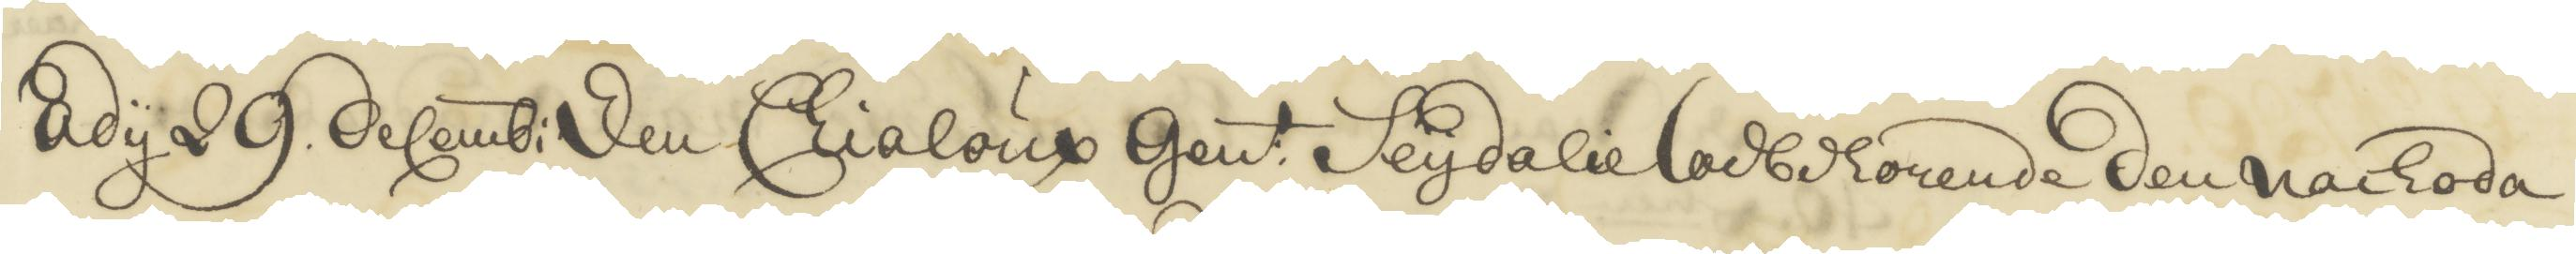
adij 29. decemb: Een Chialoup Gen:t Seijdalie toebehorende den nachoda
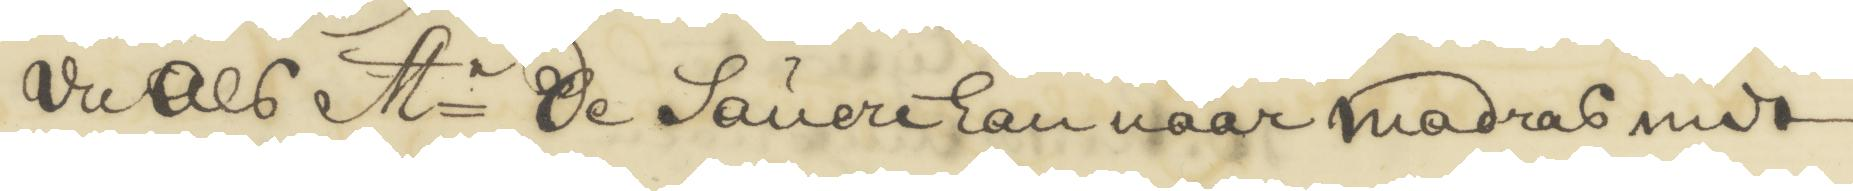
en als M=r de Sauerchan naar madras met
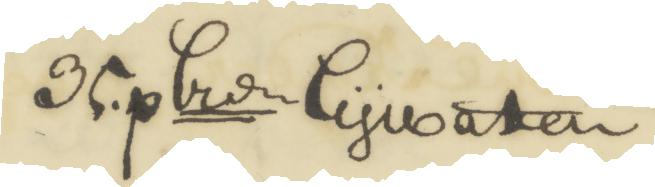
35. p=ken lijwaten
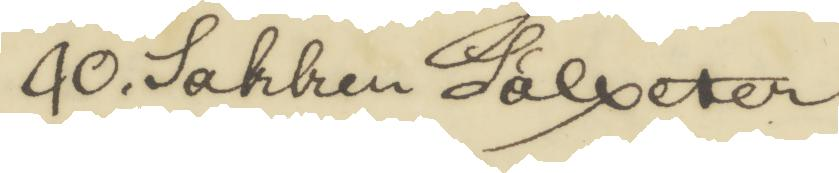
40. sakken salpeter
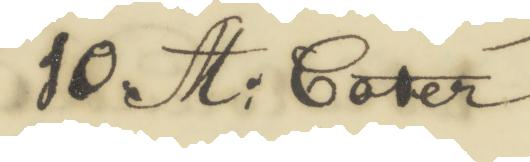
10 M: boter
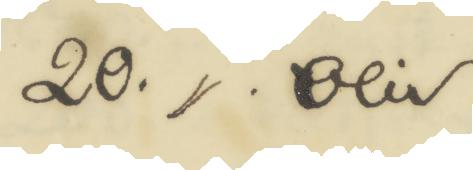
20. „ . olie
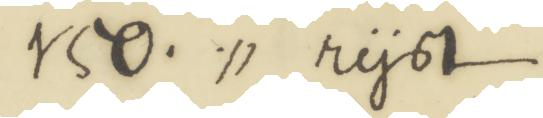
150. „ rijst
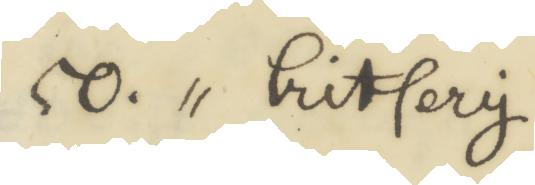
50. „ kitserij
